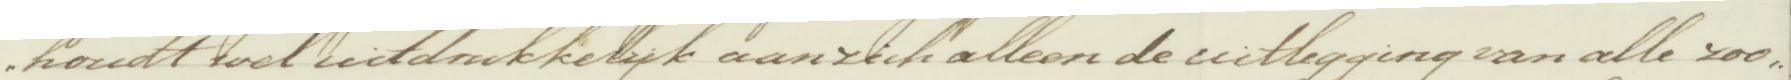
„houdt wel uitdrukkelijk aan zich alleen de uitlegging van alle zoo„
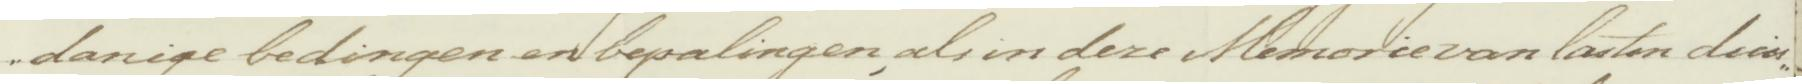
„danige bedingen en bepalingen, als in deze Memorie van lasten duis„
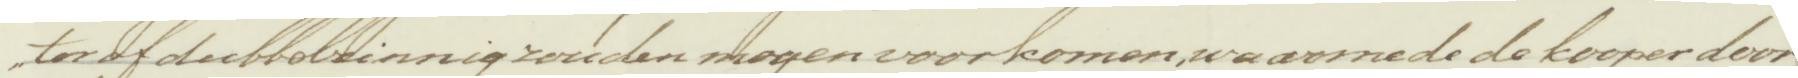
„ter of dubbelzinnig zouden mogen voorkomen, waarmede de kooper, door
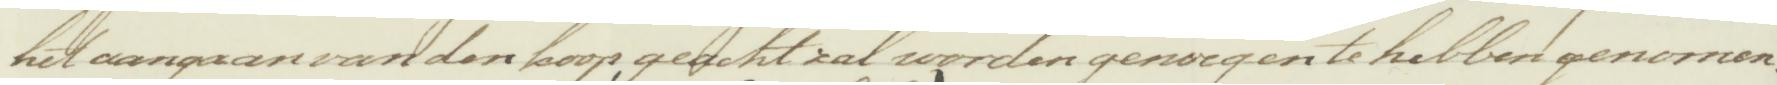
het aangaan van den koop, geacht zal worden genoegen te hebben genomen
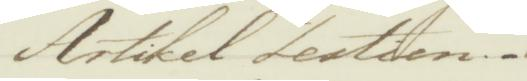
Artikel Zestien.-
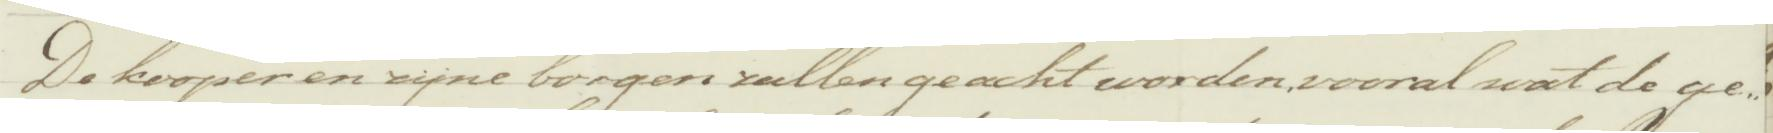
De kooper en zijne borgen zullen geacht worden, vooralwat de ge„
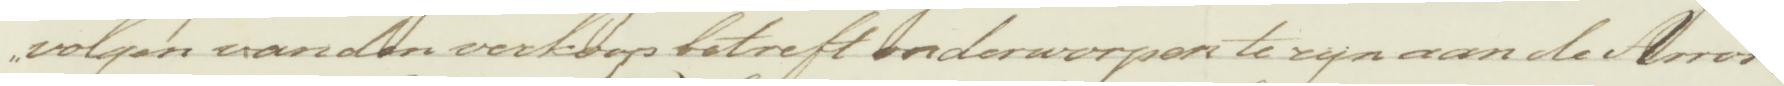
„volgen van den verkoop betreft onderworpen te zijn aan de Arron
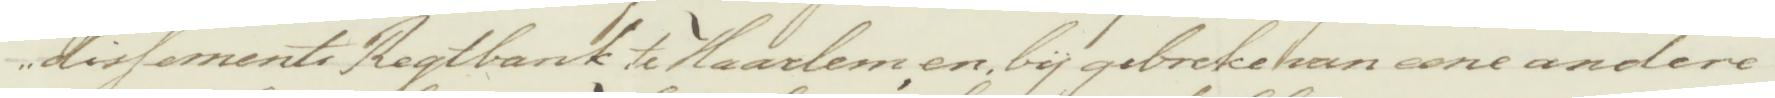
„dissements Regtbank te Haarlem, en, bij gebreke van eene andere
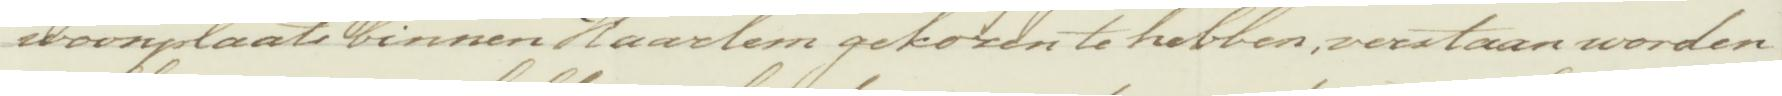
woonplaats binnen Haarlem gekozen te hebben, verstaan worden
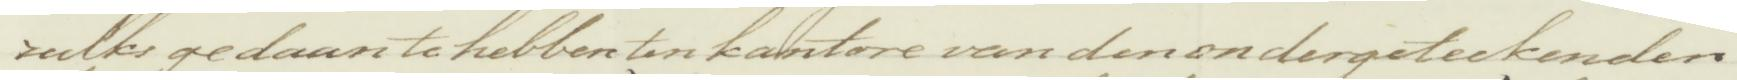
zulks gedaan te hebben ten kantore van den ondergeteekenden
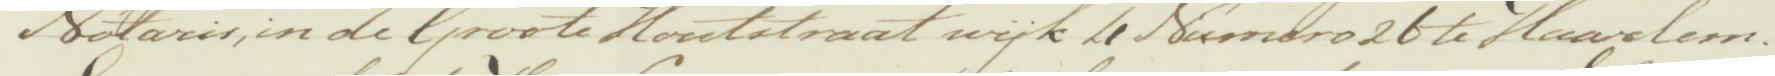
Notaris, in de Groote Houtstraat wijk 4 Numero 26 te Haarlem.
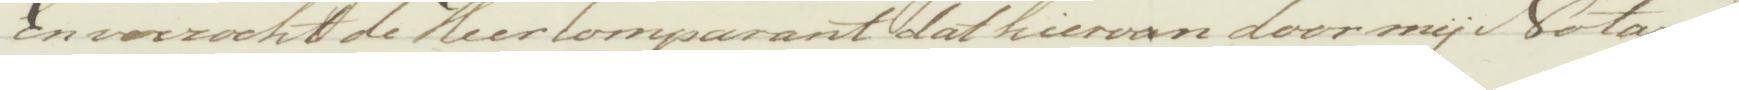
En verzocht de Heer Comparant dat hiervan door mij Notaris
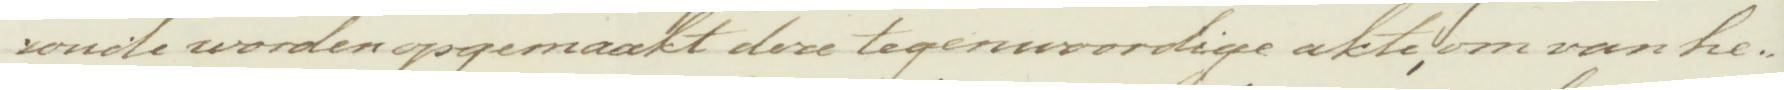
zoude worden opgemaakt deze tegenwoordige akte, om van he„
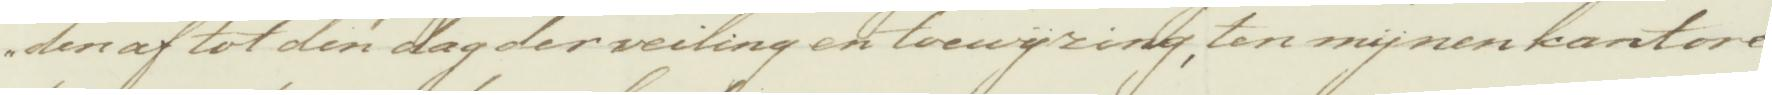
„den af tot den dag der veiling en toewijzing, ten mijnen kantore
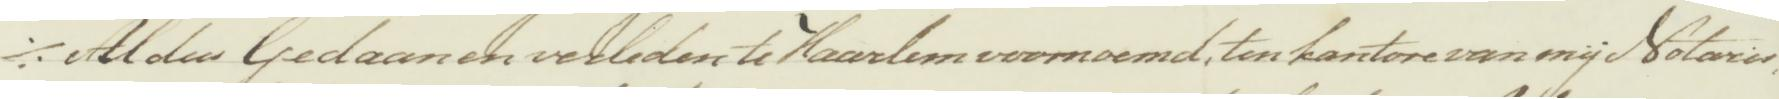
Aldus Gedaan en verleden te Haarlem voornoemd, ten kantore van mij Notaris
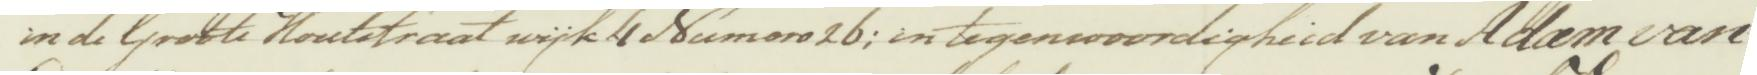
in de Groote Houtstraat wijk 4 Numero 26; in tegenwoordigheid van Adam van
